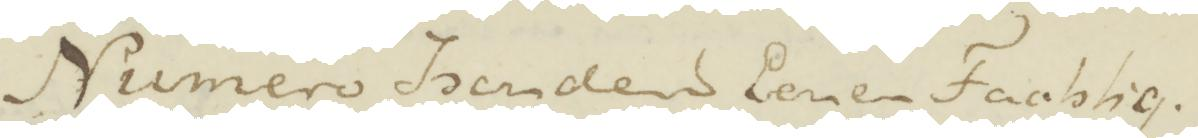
Numero honderd Een en Tachtig.
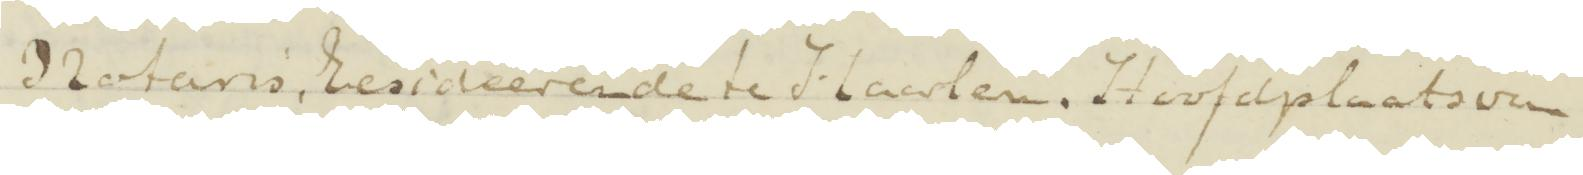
Notaris, resideerende te Haarlem, Hoofdplaats van
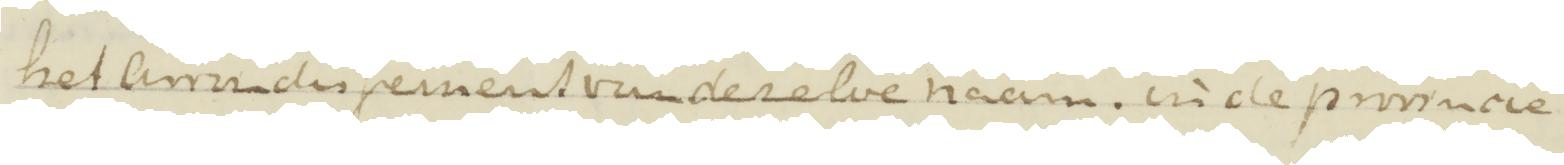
het arrondissement van dezelve naam, in de provincie
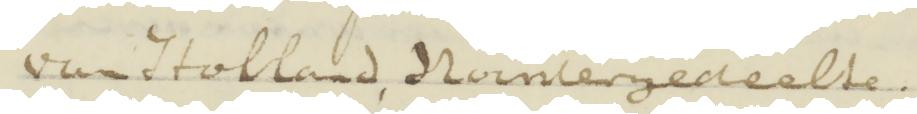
van Holland, Noordergedeelte.
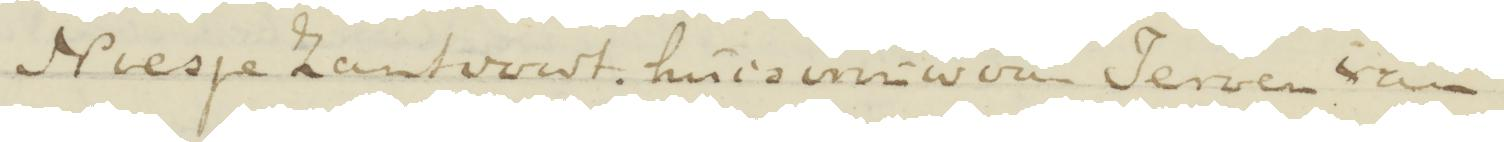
Niesje Zantvoort, huisvouw van Jeroen van
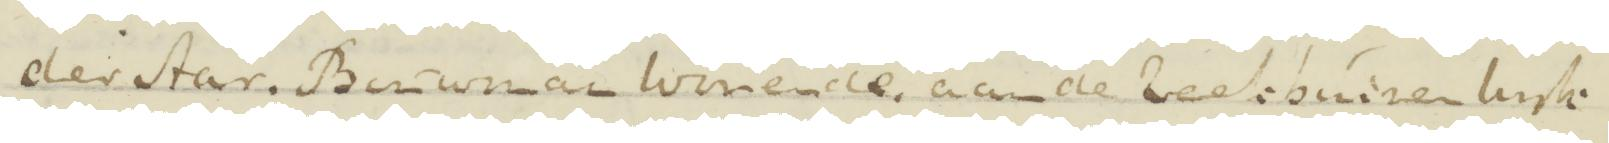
der Aar. Bouwman wonende aan de reekhuizen wyk
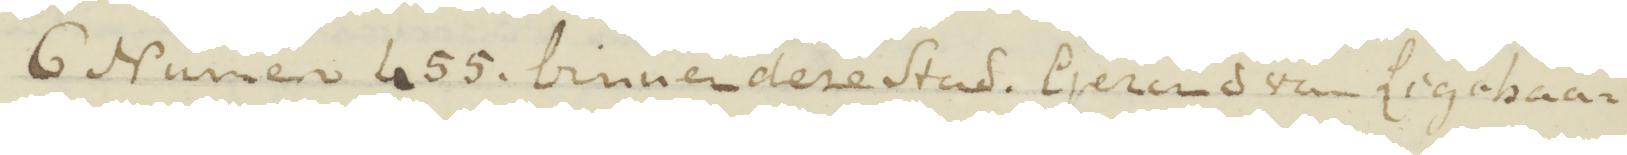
6 Numero 455. binnen deze stad. Gezond van Lichaa=
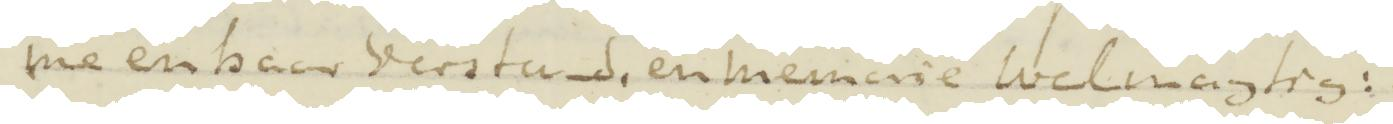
me en haar verstand, en memorie welmagtig:
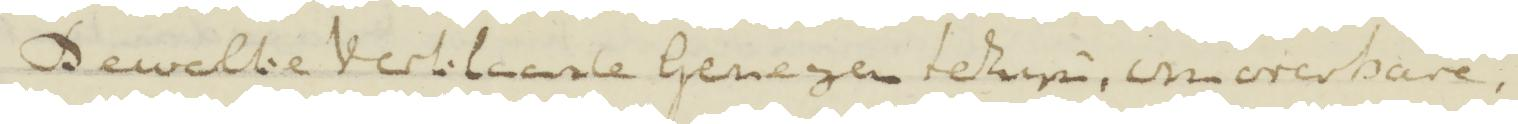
Dewelke Verklaarde Genegen te zijn, om over hare,
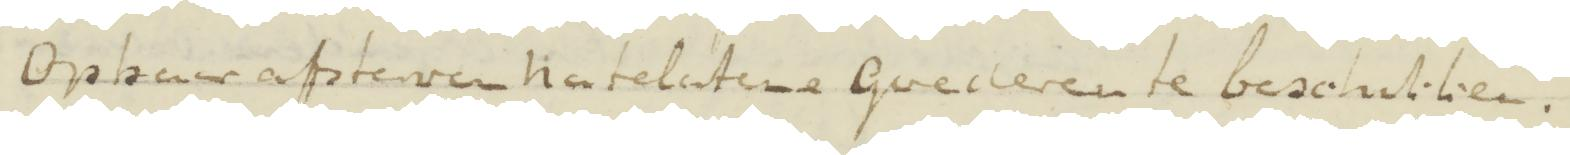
openbaar afsterven natelatene Goederen te beschikken,
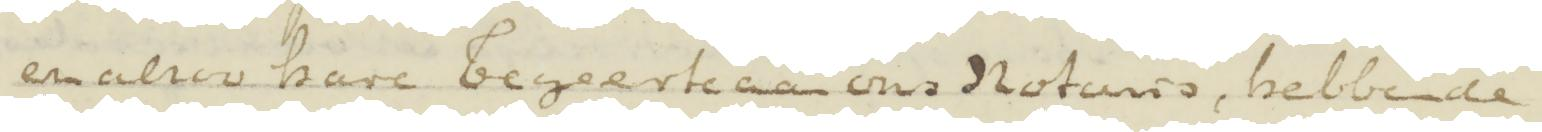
en alzoo hare begeerte aan ons Notaris, hebbende
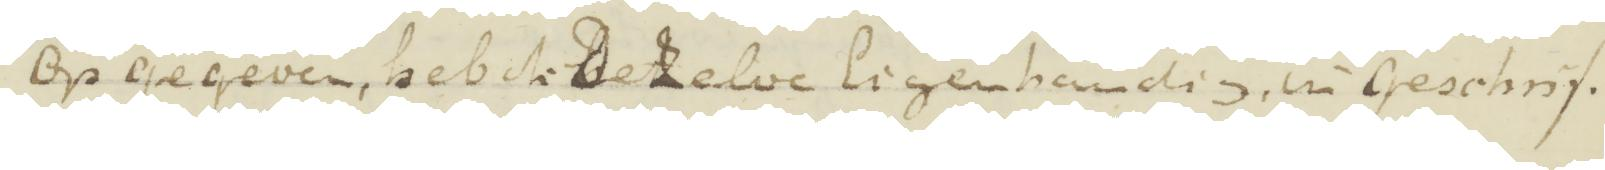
opgegeven, heb ik dezelve Eigenhandig, in Geschrif.
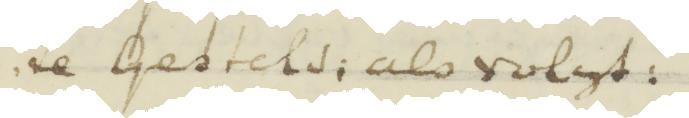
„te Gesteld; als volgt:
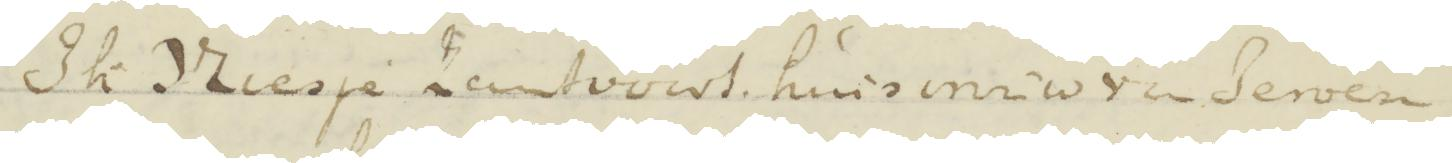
Jk Niesje Zantvoort, huisvrouw van Jeroen
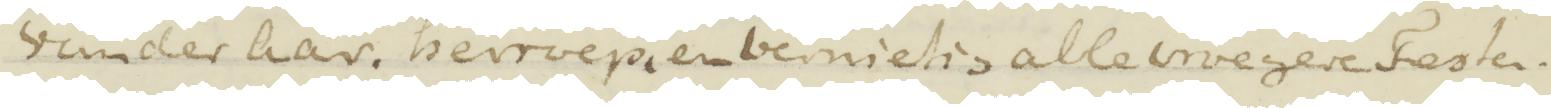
van der Aar, herroep, en vernietig alle vroegere Testa-
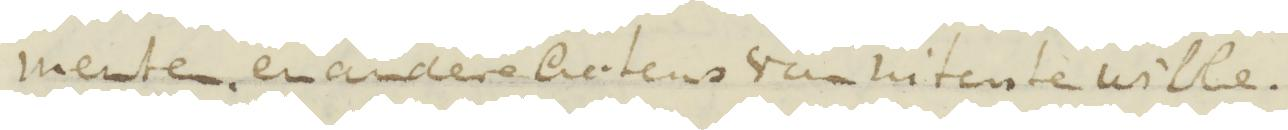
menten, en andere Actens van uiterste wille.
